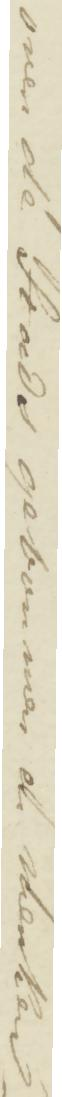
over de Stads gebouwen en werken
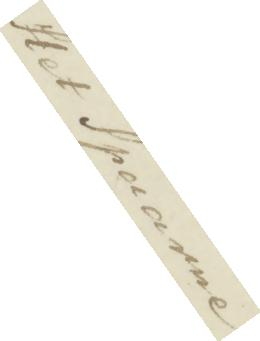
Het Spaarne
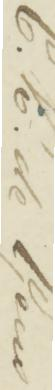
C.K. de Geus
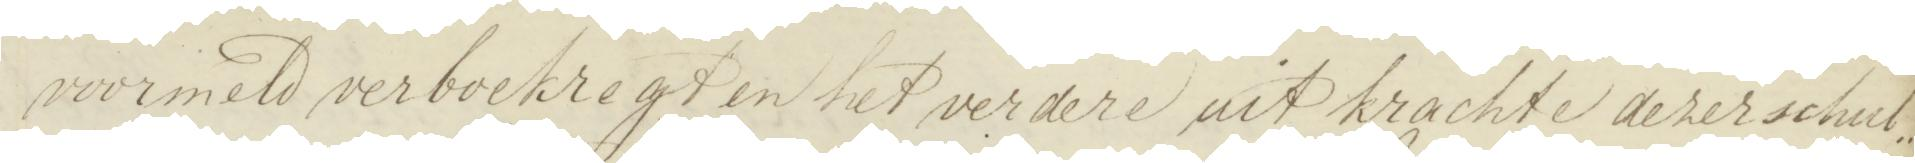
voormeld verboekregt en het verdere, uit krachte dezer schul,
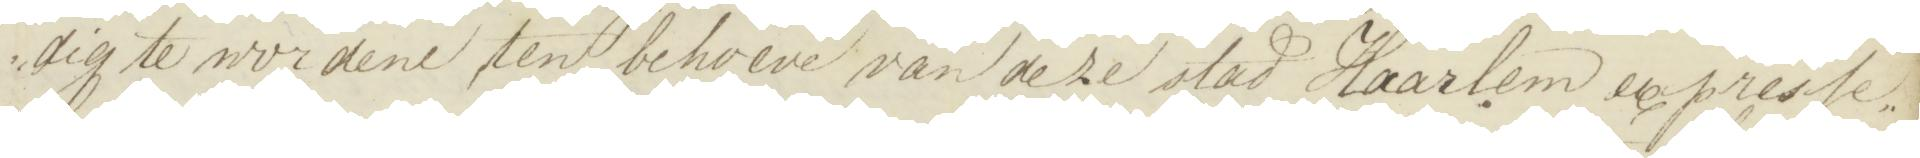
„dig te wordene, ten behoeve van deze stad Haarlem expresse„
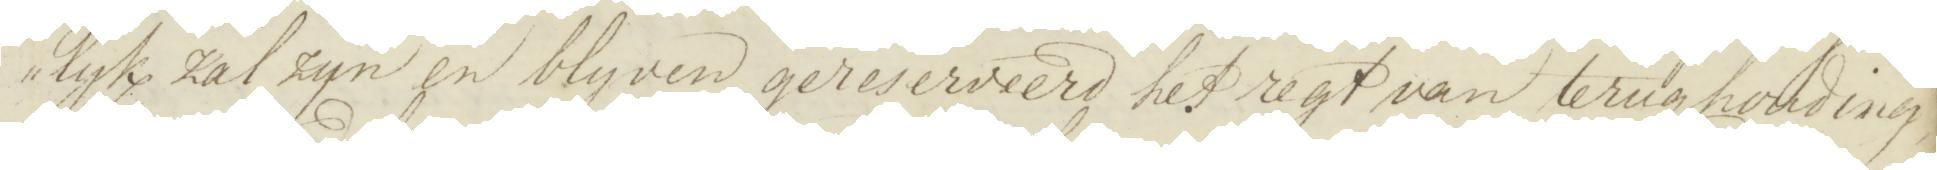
„lyk zal zyn en blyven gereserveerd het regt van terughouding
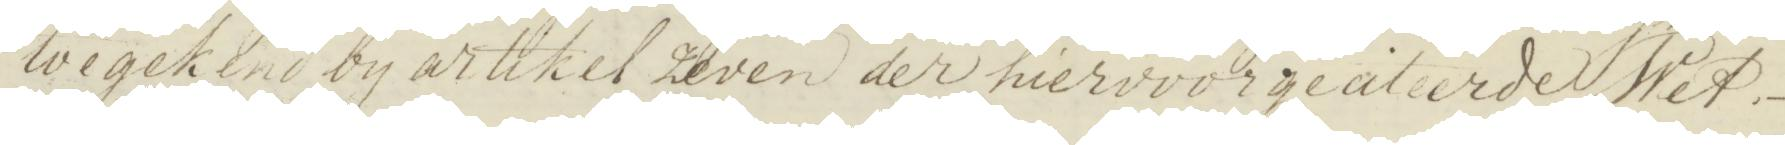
toegekend by artikel zeven der hiervoor geciteerde Wet. —
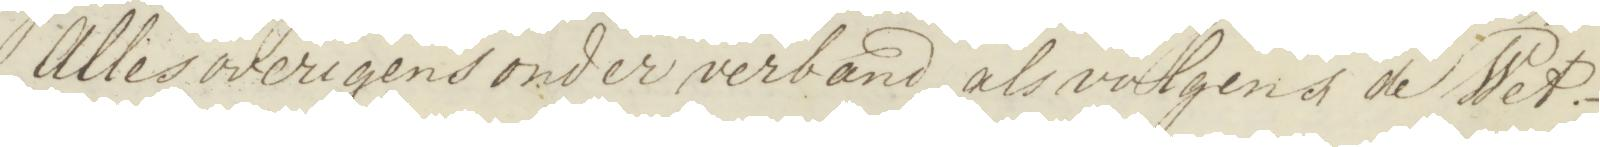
Alles overigens onder verband, als volgens de Wet.
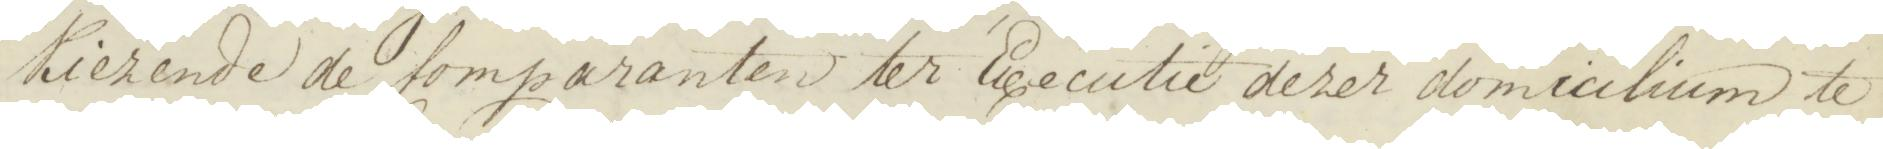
kiezende de Comparanten ter Executie dezer domicilium te
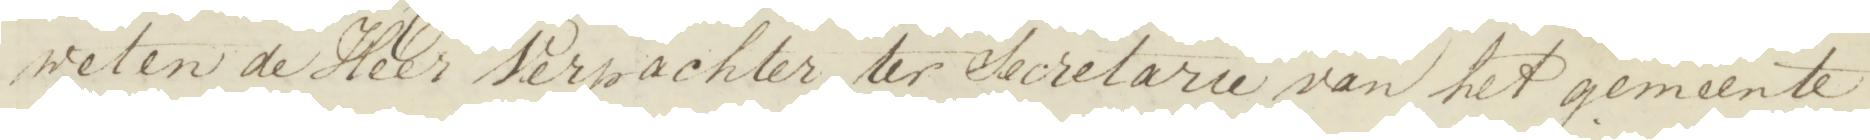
weten de Heer Verpachter ter Secretarie van het gemeente
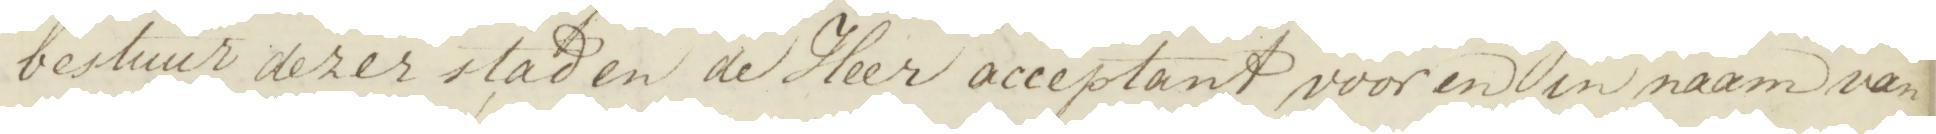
bestuur dezer stad en de Heer acceptant voor en in naam van
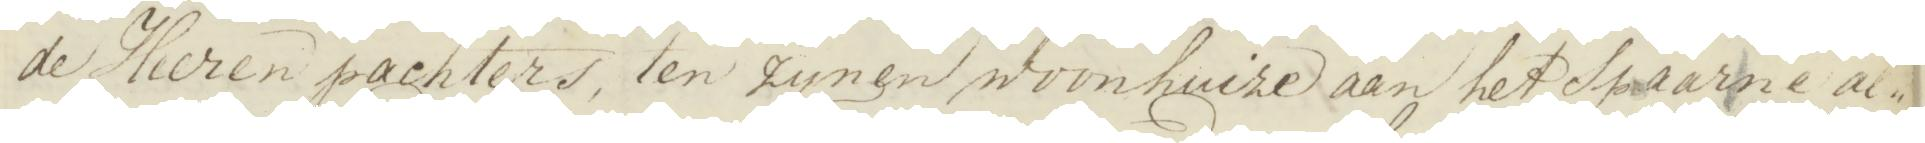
de Heeren pachters, ten zynen woonhuize aan het spaarne al„
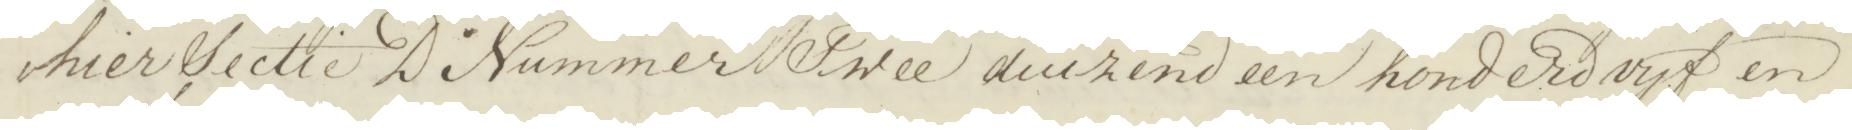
hier sectie D Nummer Twee duizend een honderd vyf en
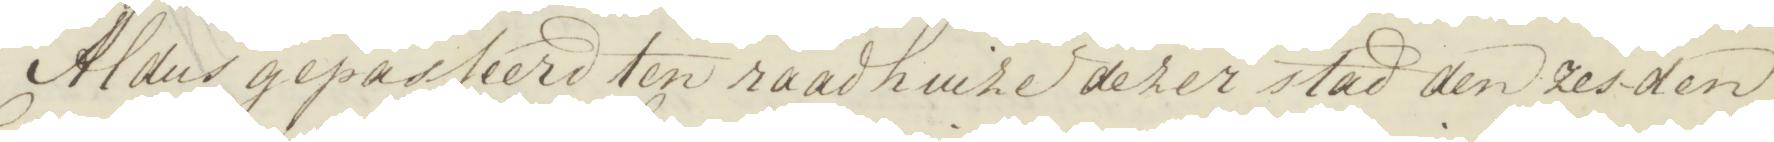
Aldus gepasseerd ten raadhuize dezer stad den zesden
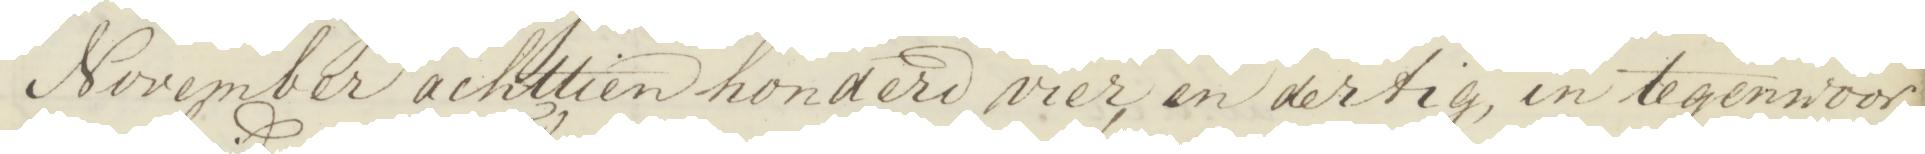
November achttien honderd vier en dertig, in tegenwoor
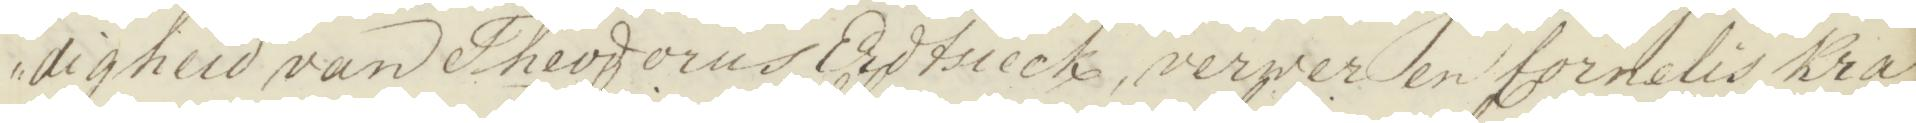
„digheid van Theodorus Erdtsieck, verwer en Cornelis Kra,
